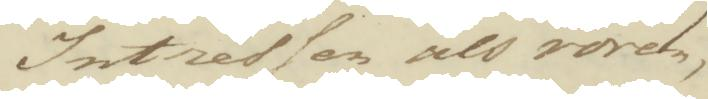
Intressen als voren,
